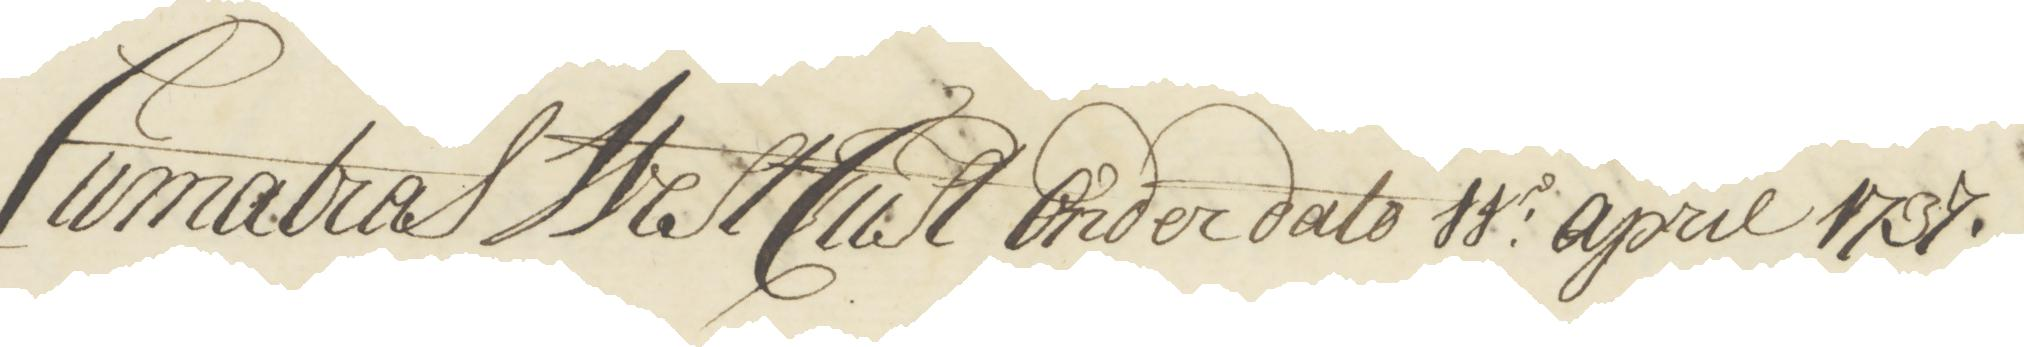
Van Sumatras West Cust onder dato 14:' april 1737.
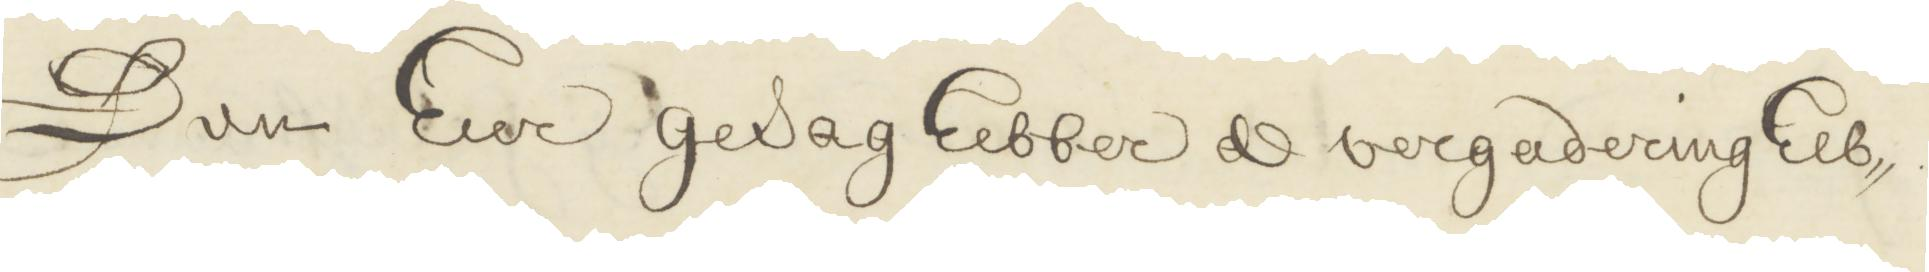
Den heer gesaghebber de vergadering heb„
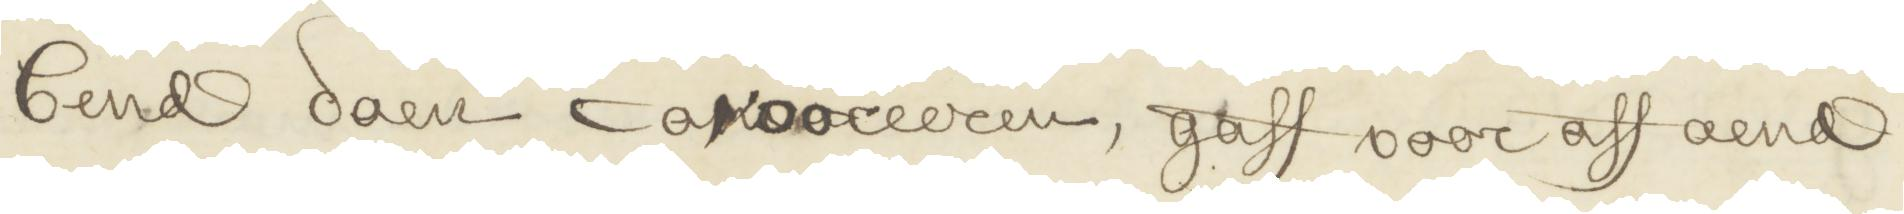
bende doen covooceeren, gaff voor aff aende
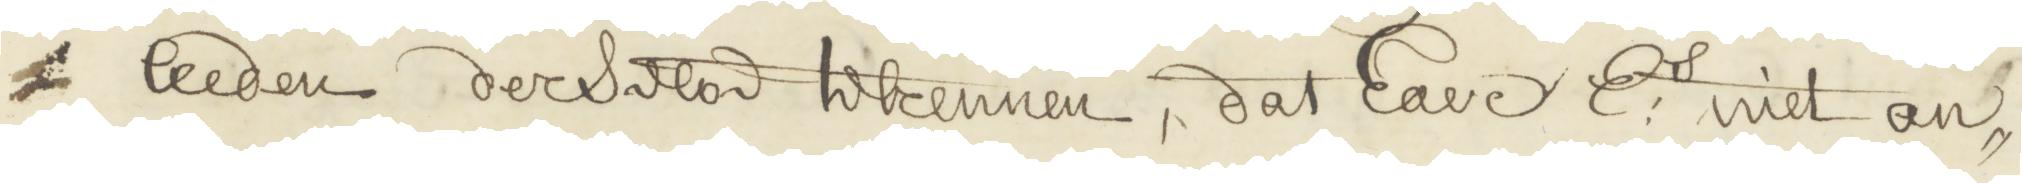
leeden derselve tekennen, dat haer E:s niet on„
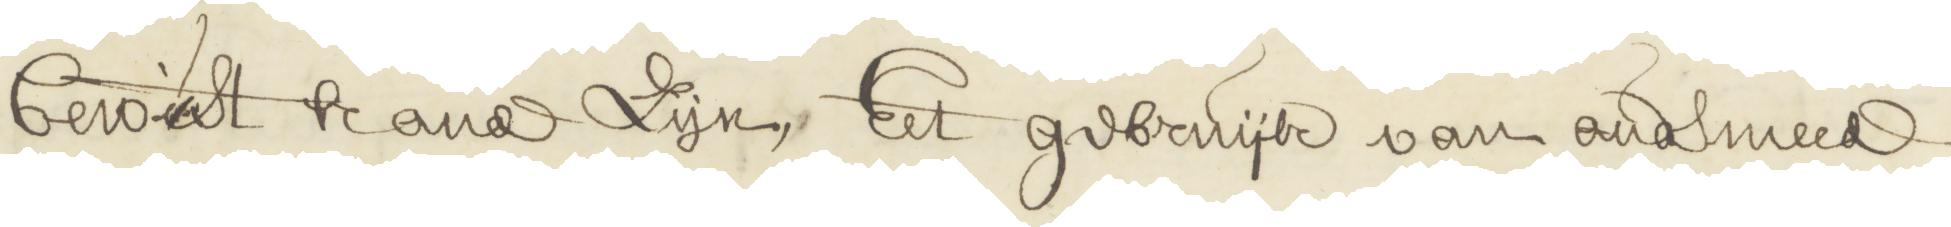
bewust konde zijn, het gebruijk van oudsmeede
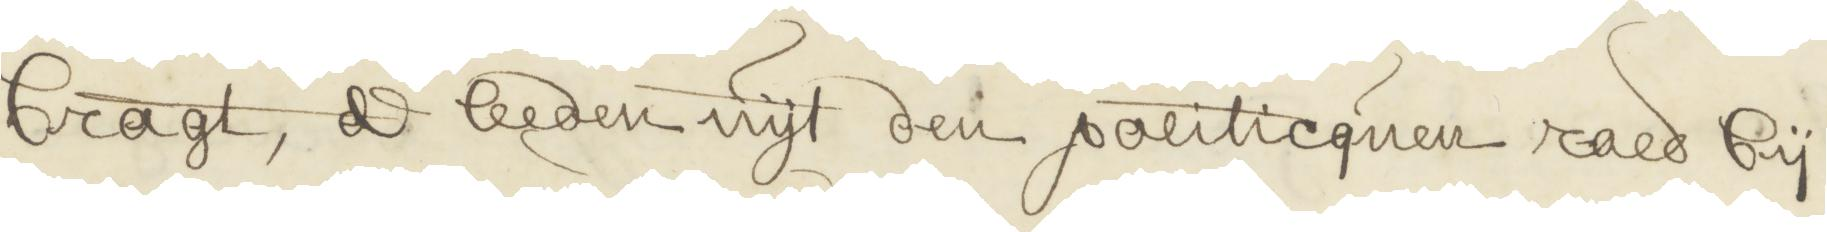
bragt, de leeden uijt den politicquen raad bij
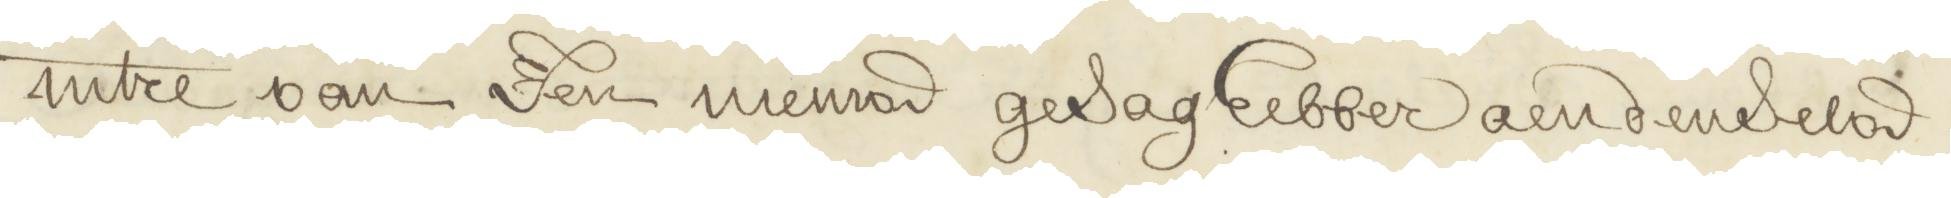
intre van Een nieuwe gesaghebber aen denselve
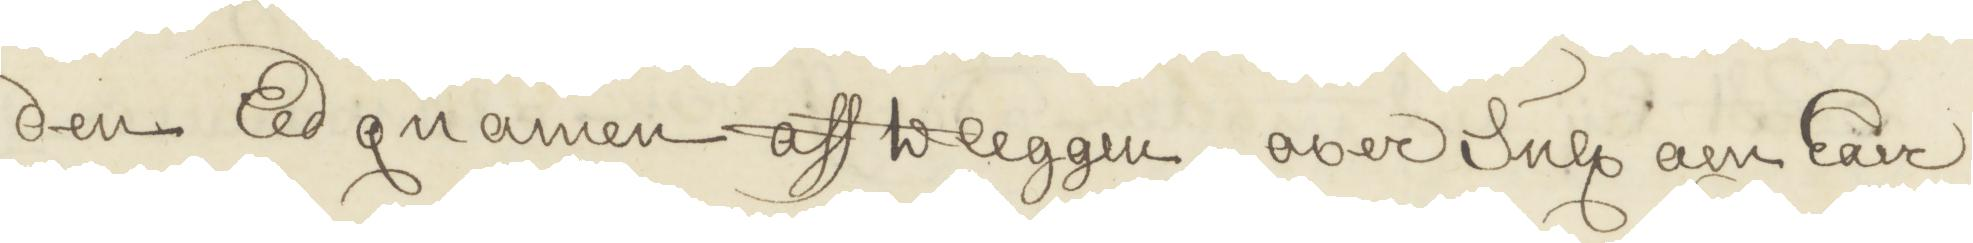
den Eed quamen aff te leggen, over sulx aen har
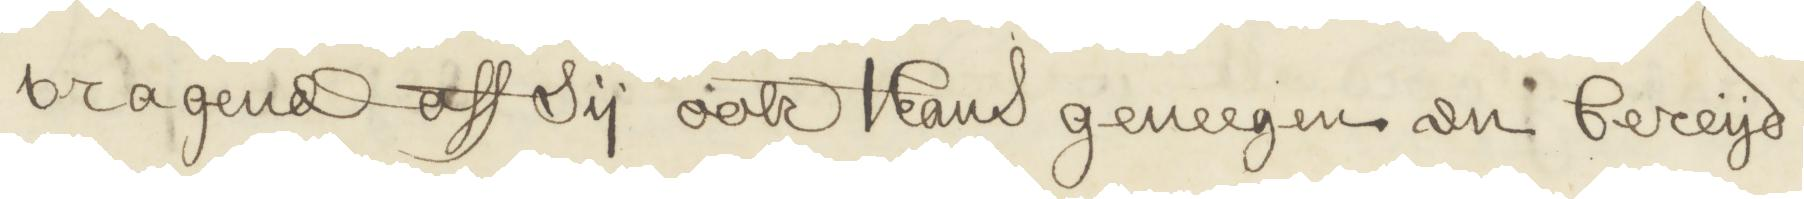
vragende off sij ook thans geneegen en bereijd
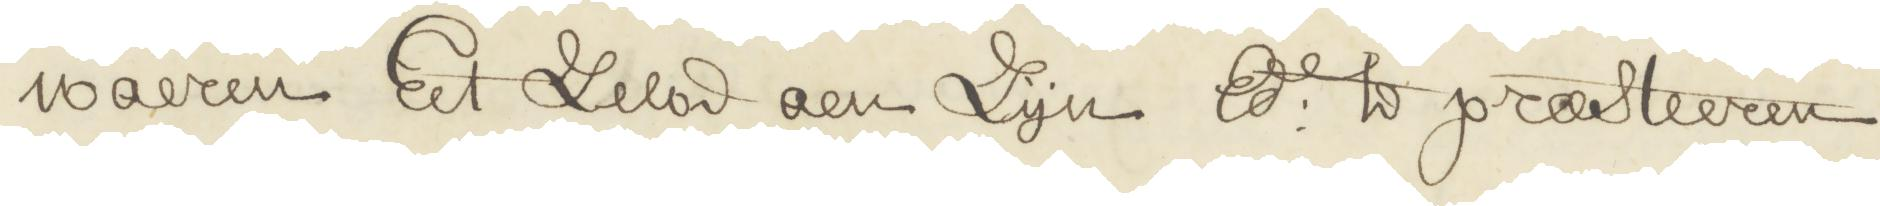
waeren het zelve aen zijn Ed:e te praesteeren
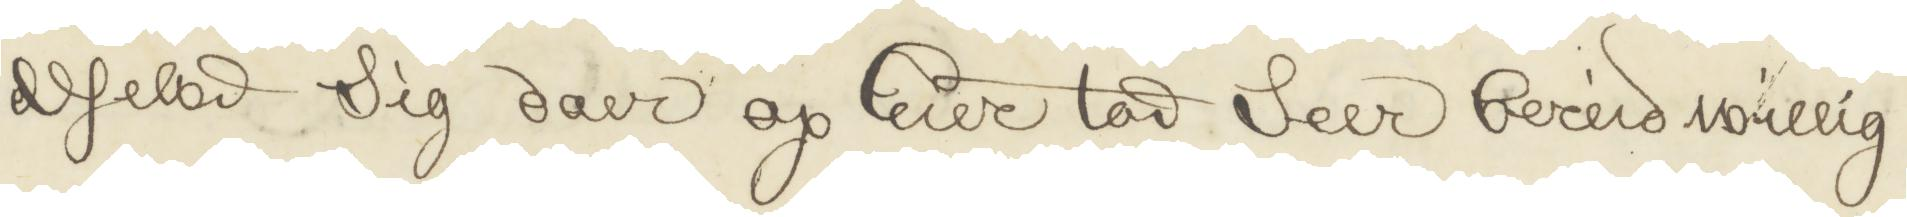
deselve sig daer op hier toe seer bereid willig
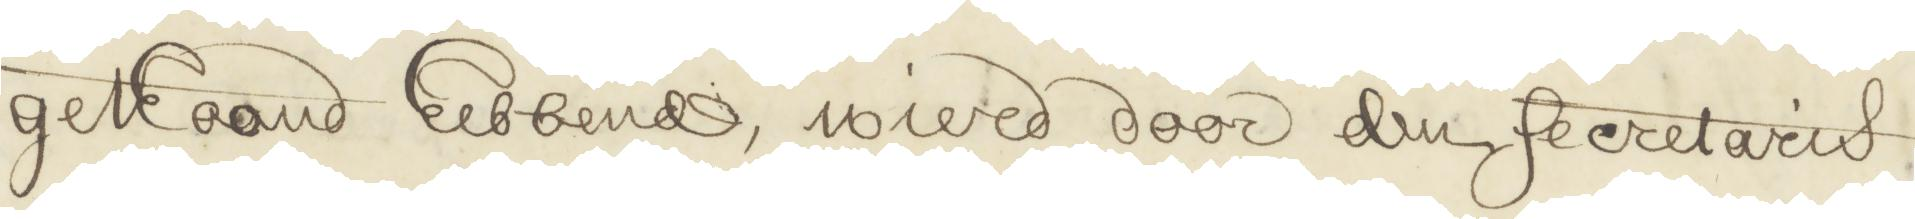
gethoond hebbende, wierd door den Secretaris
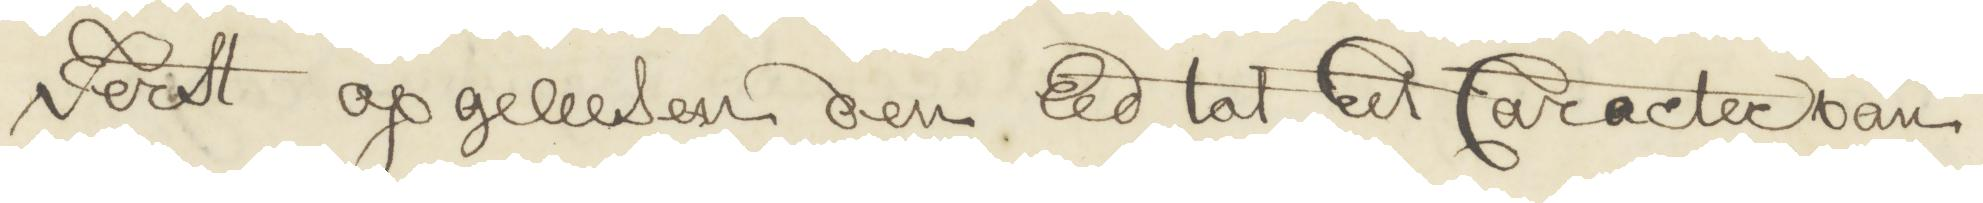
Eerst op geleesen den Eed tot het Caracter van
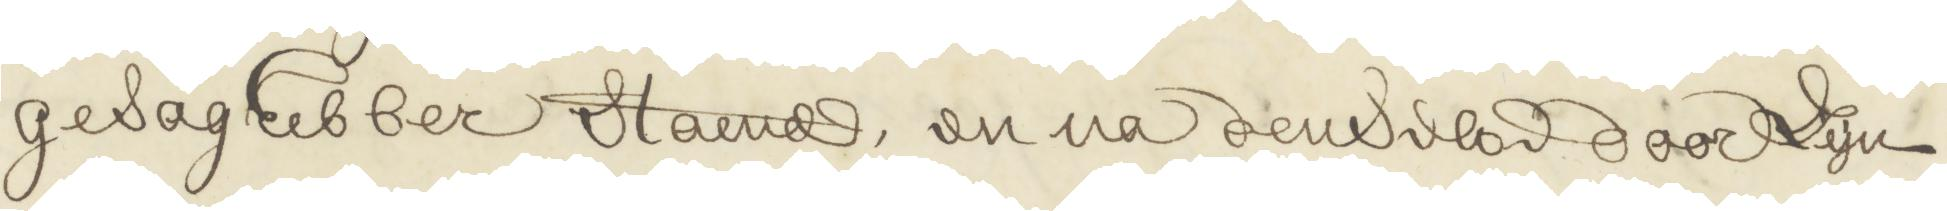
gesaghebber staende, en na denselve door zijn
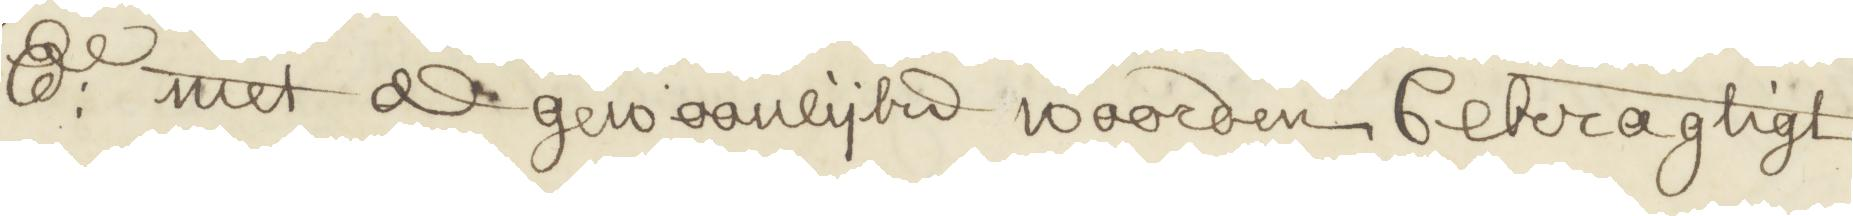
Ed:e met de gewoonlijke woorden bekragtigt
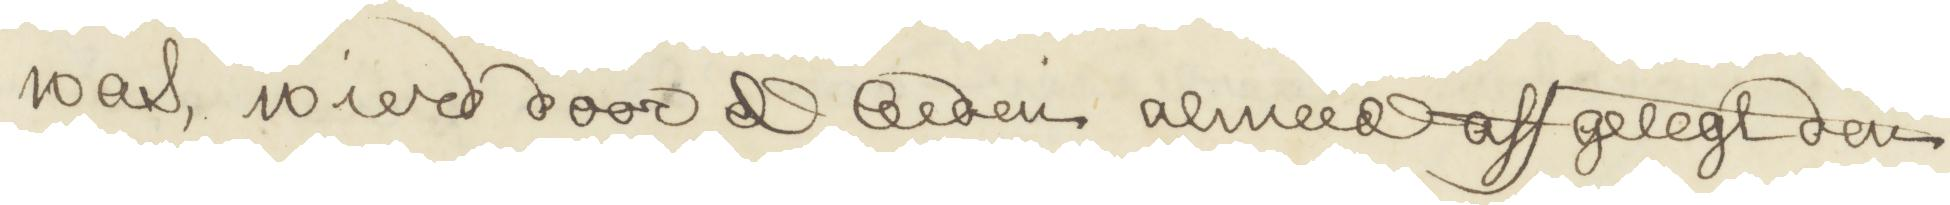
was, wierd door de leden almeede aff gelegt den
